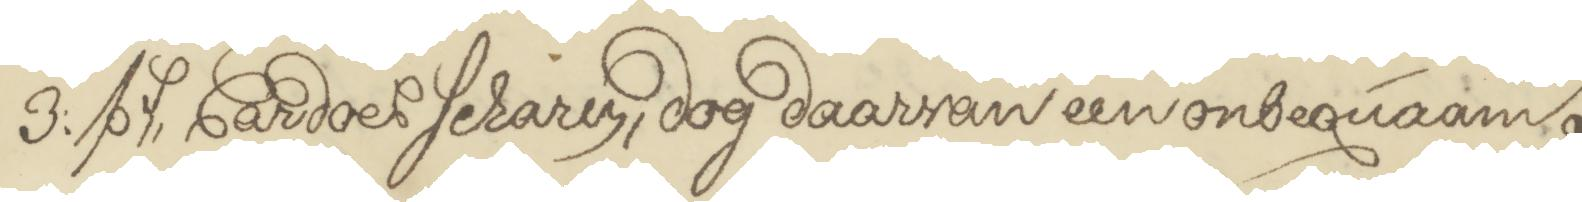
3: p„s Cardoes scharen, dog daarvan een onbequaam}
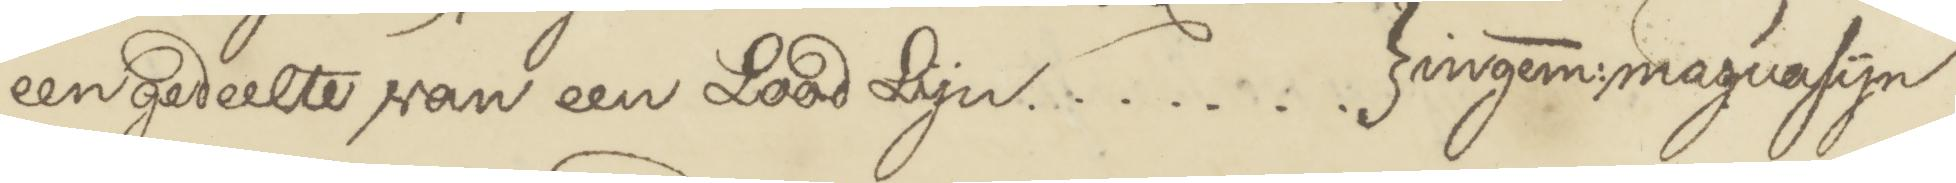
een gedeelte van een Lood Lijn. . . . . . }in gem: maguasijn
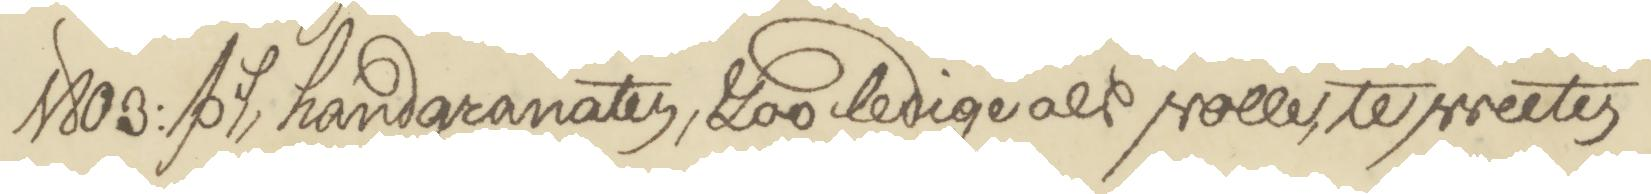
1803: p„s handgranaten, Zoo ledige als vollen, te weeten
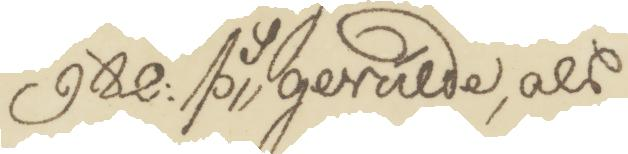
982: p„s gevulde, als
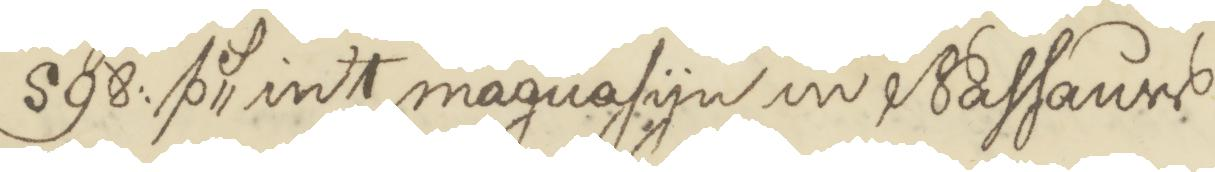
598: p„s in’t maguasijn in Nassauw
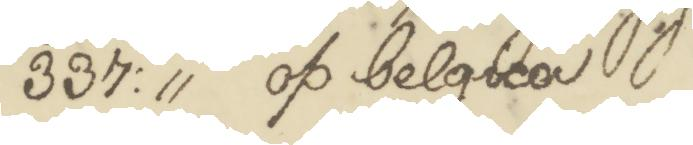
337: „ op belgica
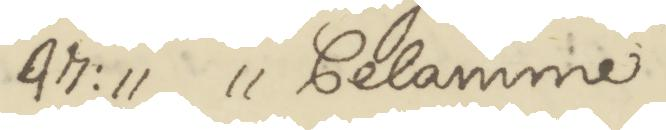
47: „ „ Celamme
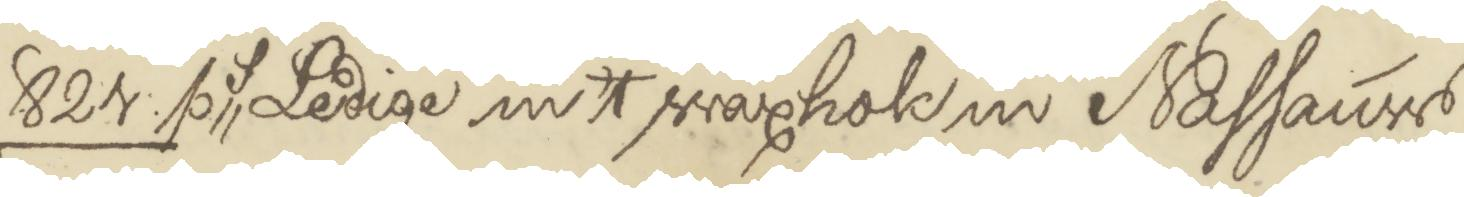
821: p„s Ledige in ’t waxhok in Nassauw
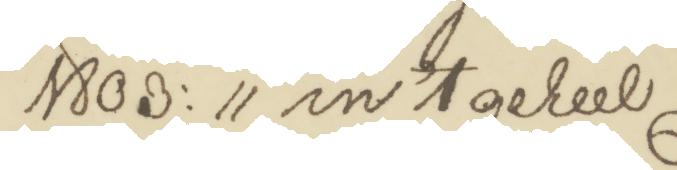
1803: „ in ’t geheel
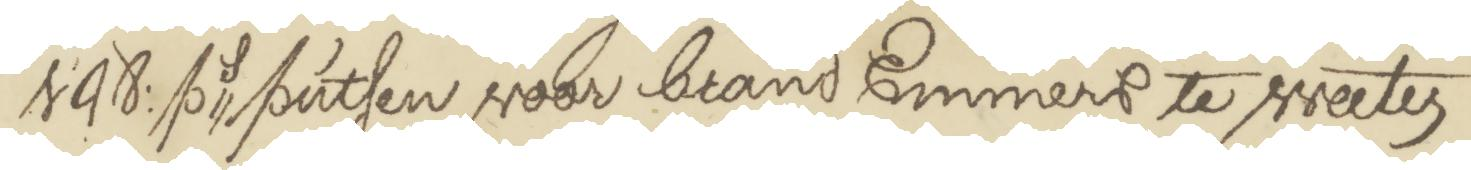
148: p„s putsen voor brand Emmers te weeten
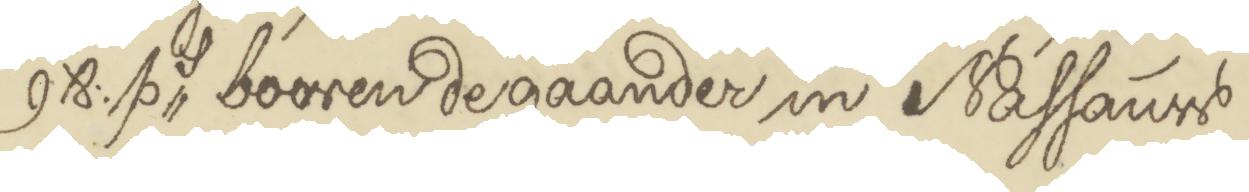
98: p„s booven de gaander in Nassauw
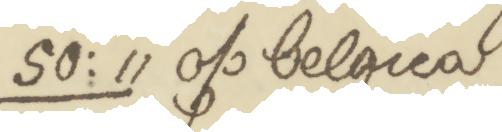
50: „ op belgica
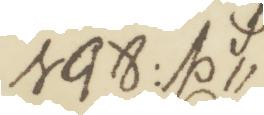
198: p„s
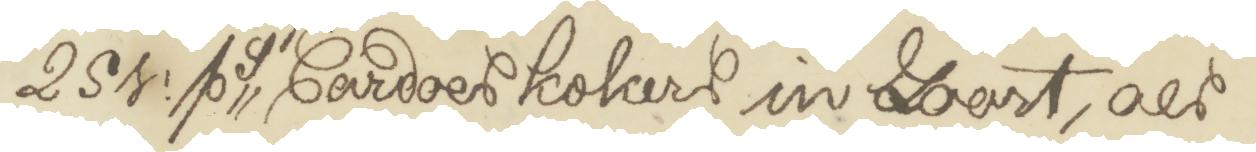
251: p„s Cardoes kokers in Zoort, als
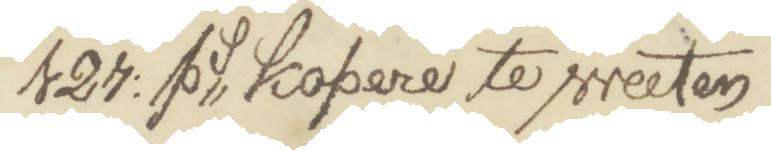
127: p„s kopere te weeten
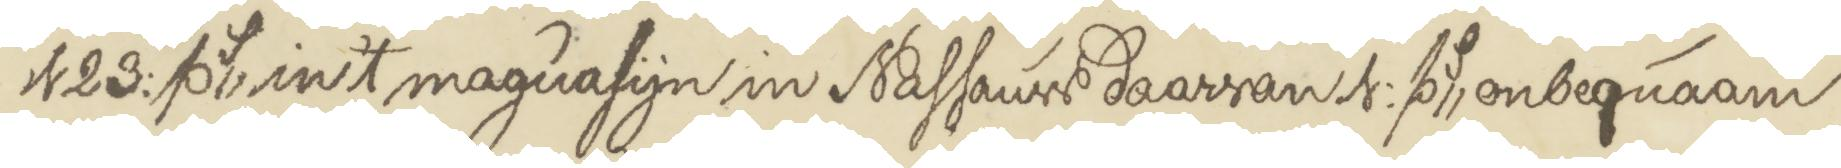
123: p„s in ’t maguasijn in Nassauws daarvan 1: p„s onbequaam
